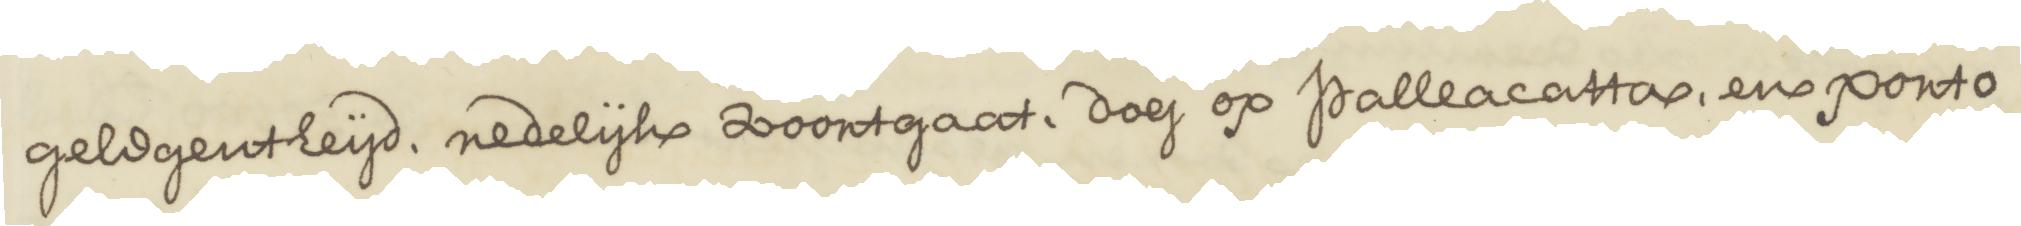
gelegentheijd, redelijk voortgaat, dog op Palleacatta, en porto
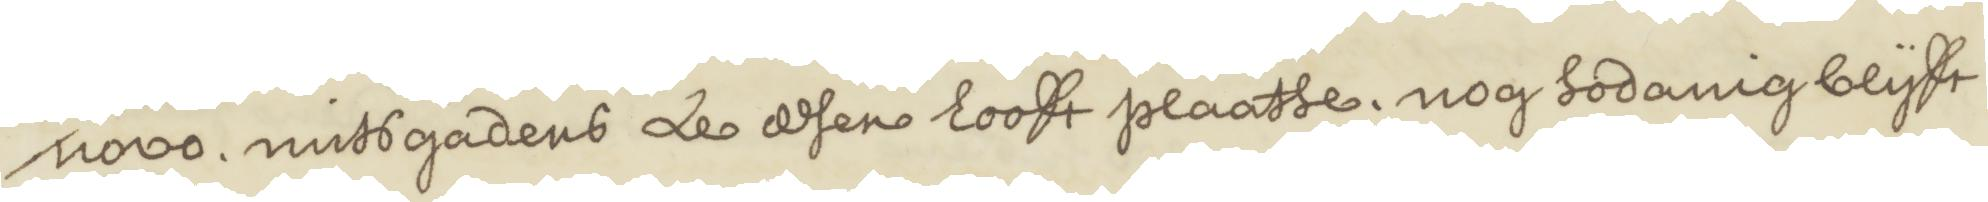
novo, mitsgaders te deser hooft plaatse, nog sodanig blijft
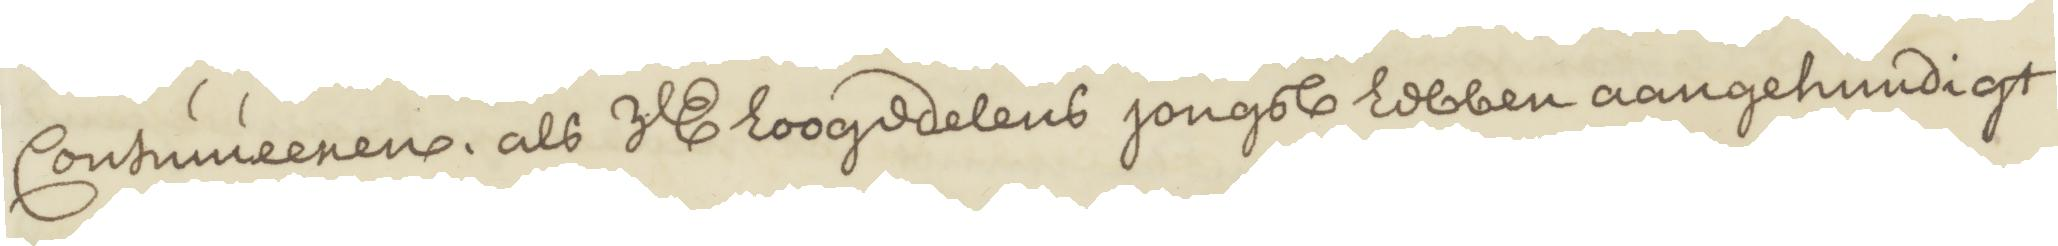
Contiuueeren, als VE hoogedelens jongst hebben aangekundigt
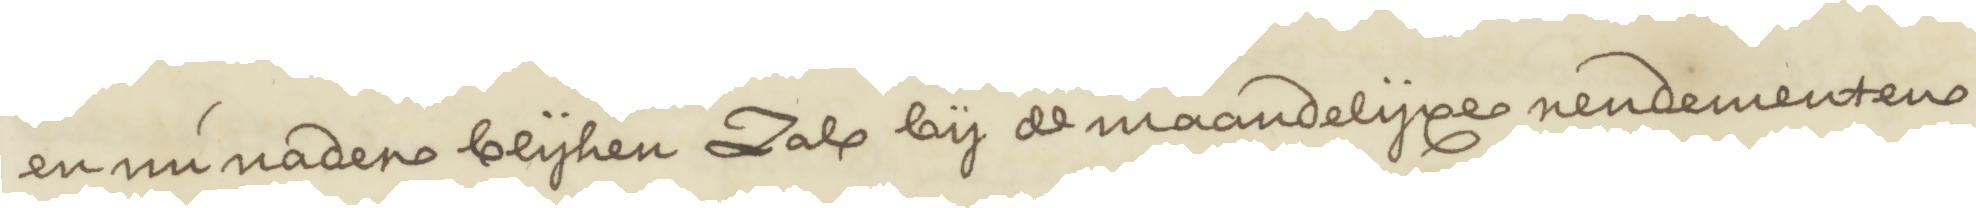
en nu nader blijken zal bij de maandelijxe rendementen
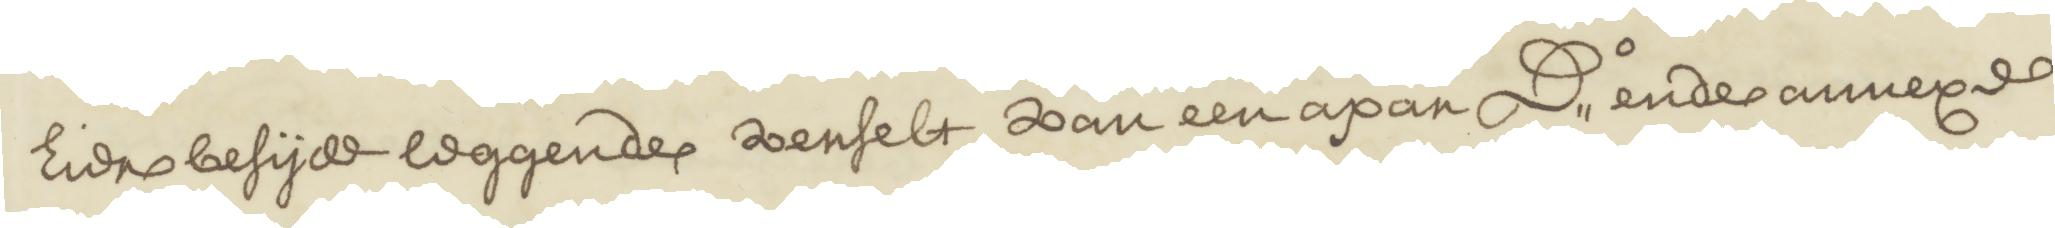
hier besijde leggende verselt van een apar D„o ende annexe
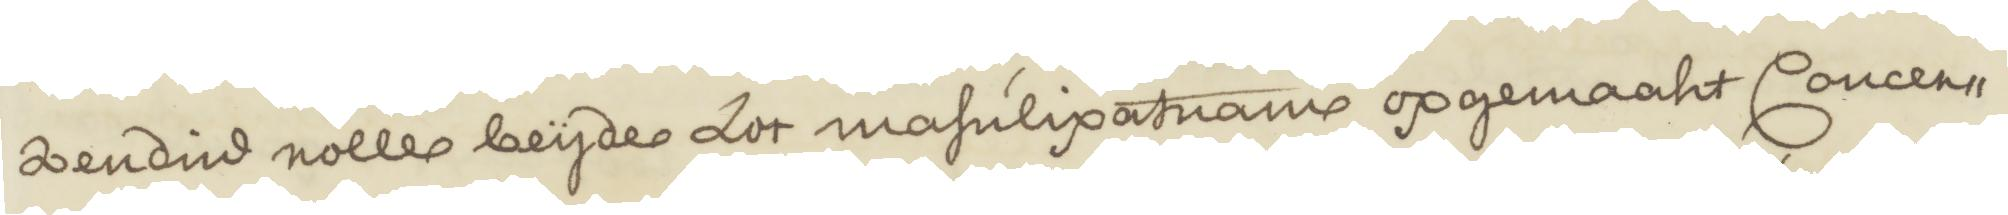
vendue rolle beijde tot masulipatnam opgemaakt Concer„
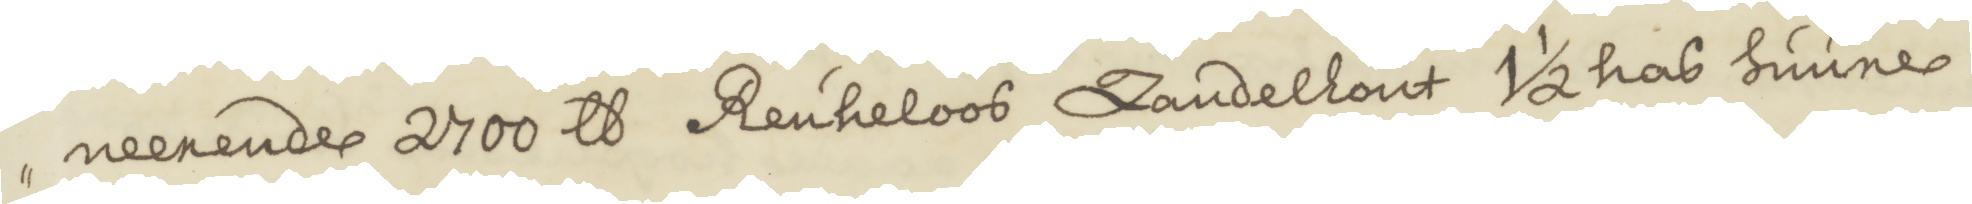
„neerende 2700 lb Reukeloos Zandelhout 1½ kas suure
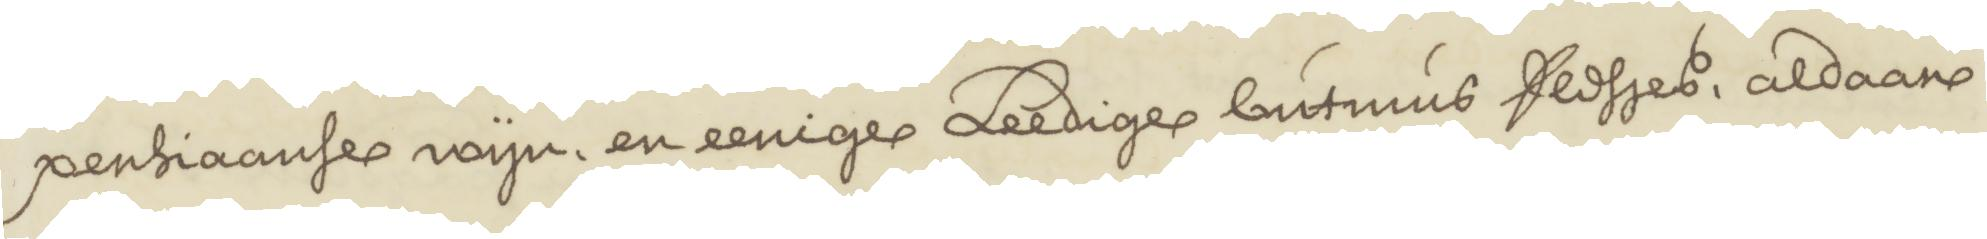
persiaanse wijn, en eenige Leedige butmus flesjes, aldaar
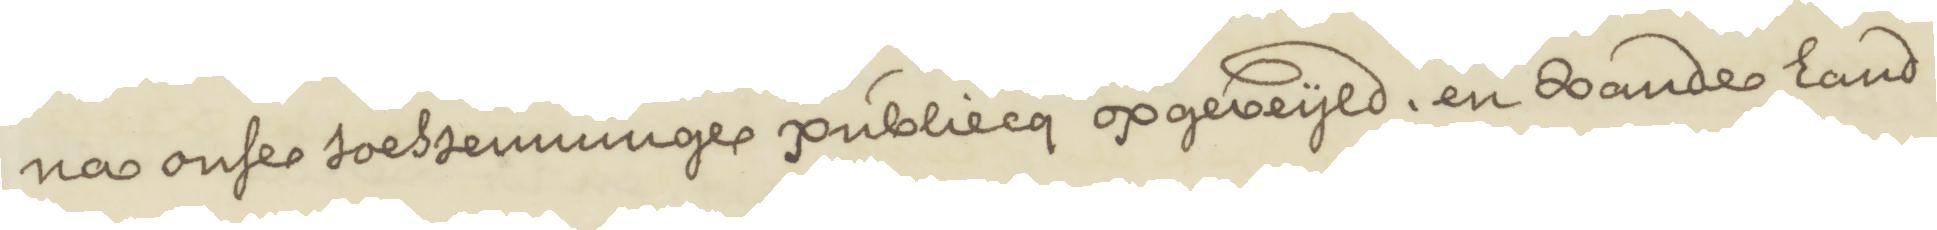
na onse toestemninge publiecq opgeveijld, en vande hand
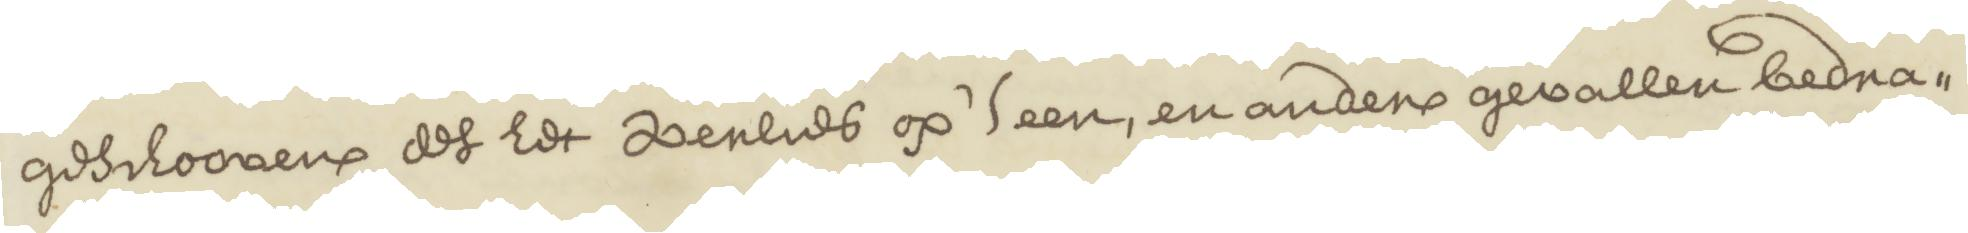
geschooven des het verlies op ’t een, en ander gevallen bedra„
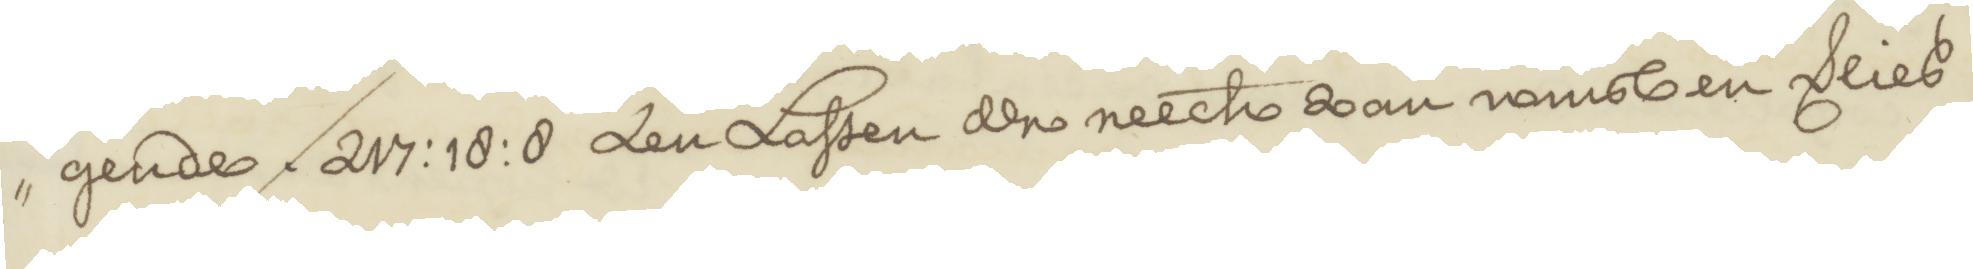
„gende ƒ 217: 18: 8 ten Lasten der reeck van winst en verlies
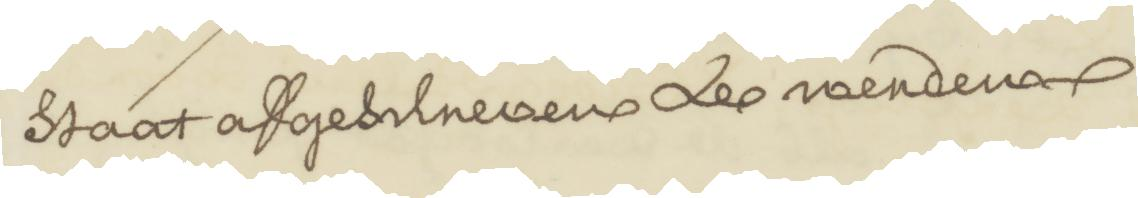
staat afgeschreven te werden —
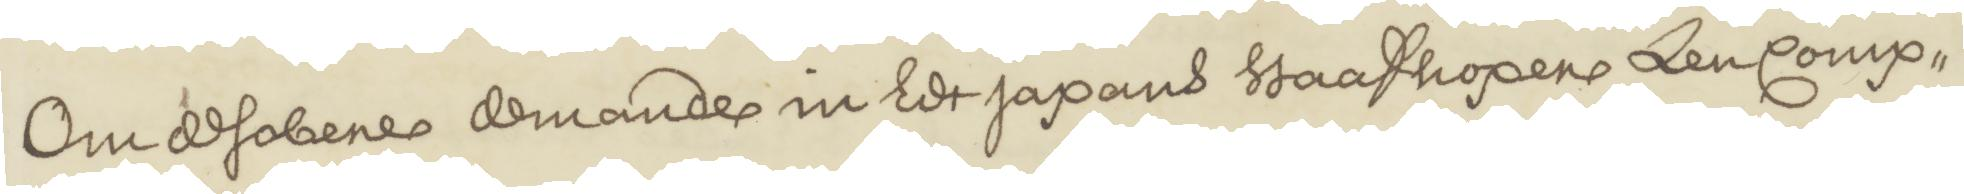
Om desobere demande in het japans staafkoper ten Comp„
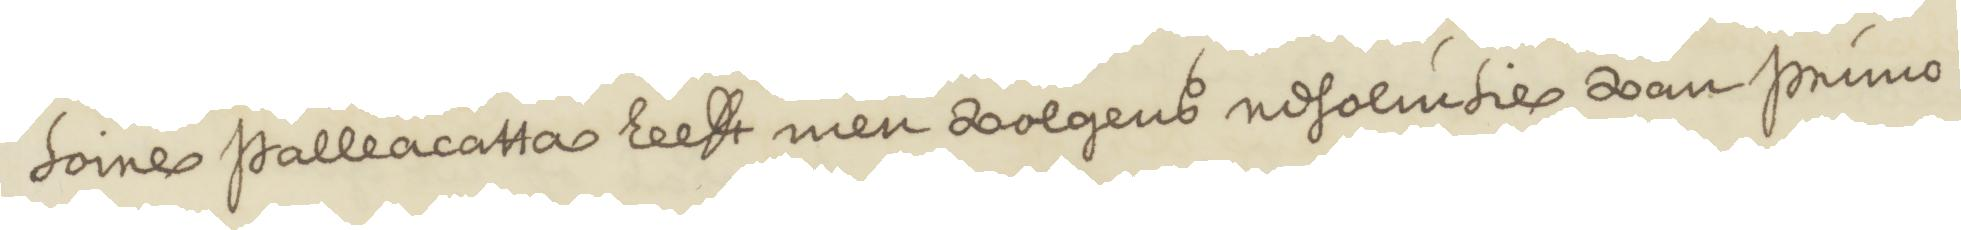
toire Palleacatta heeft men volgens resolutie van Primo
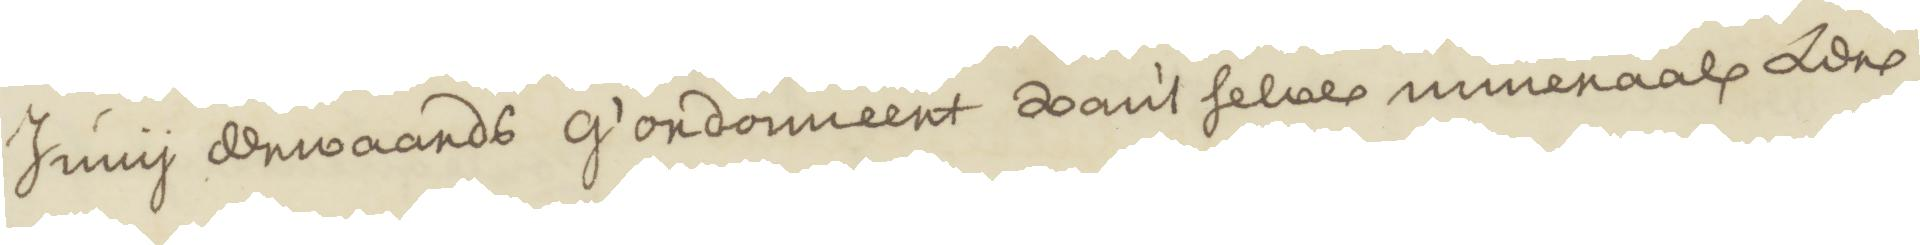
Junij derwaards g’ordonneert van’t selve mineraal ter
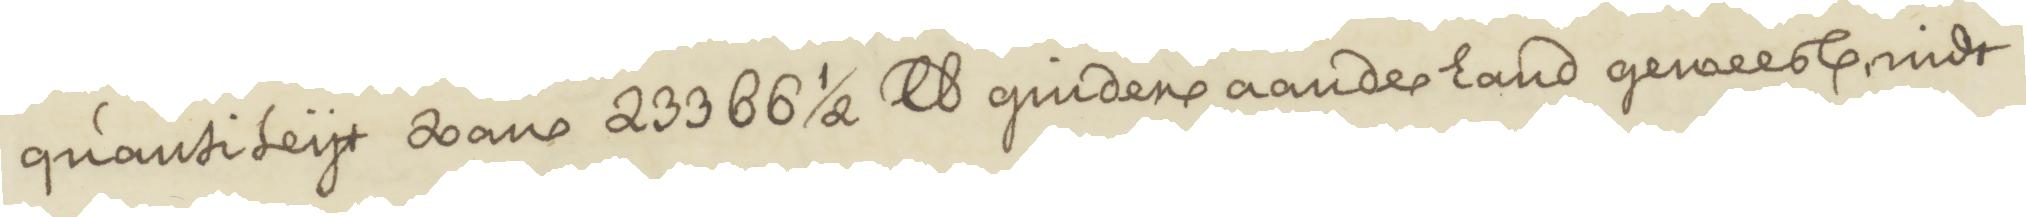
quantiteijt van 23366½ lb ginder aande hand geweest, niet
